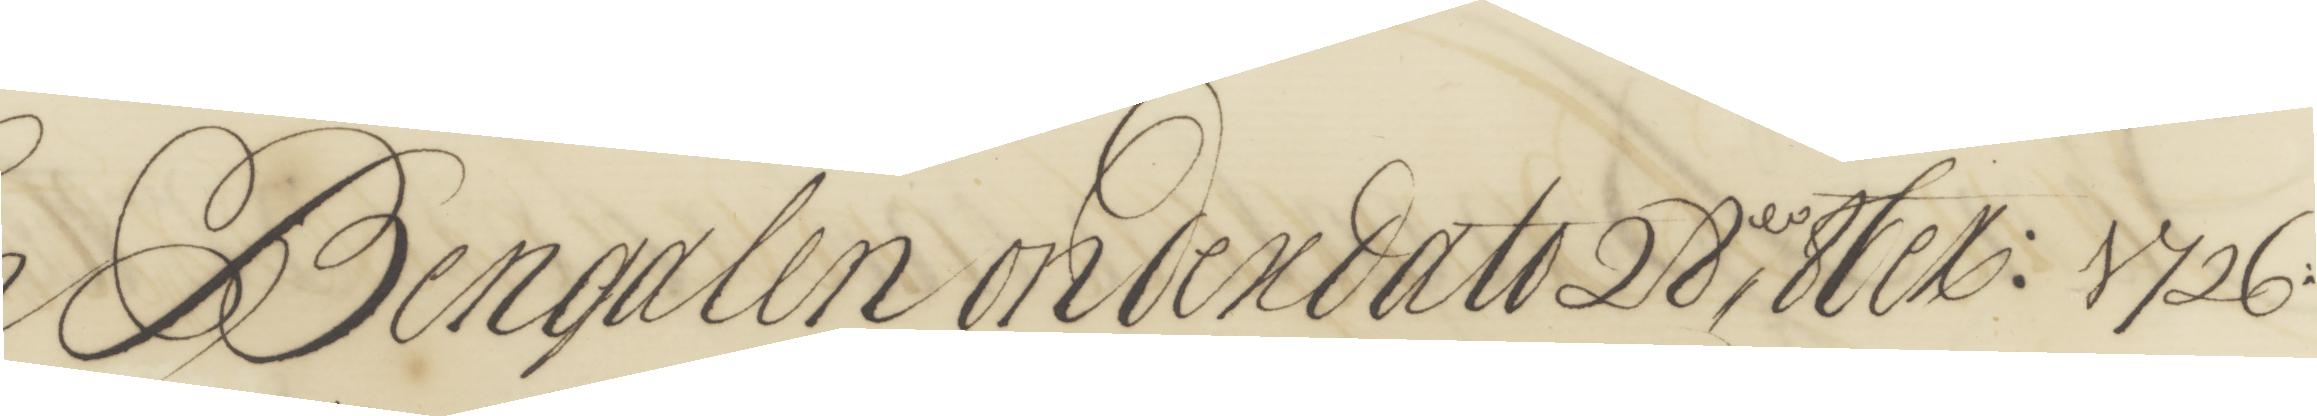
Bengalen onder dato 28„e 8ber: 1726:
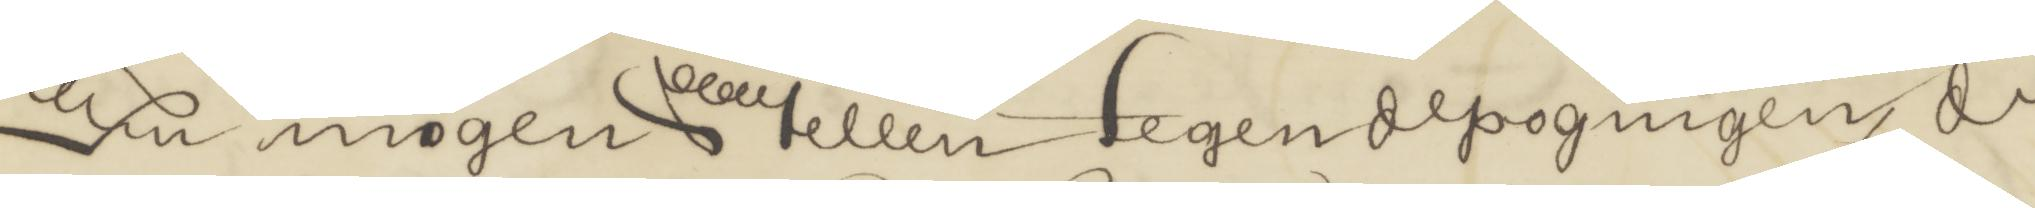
En mogen stellen tegen de pogingen, de
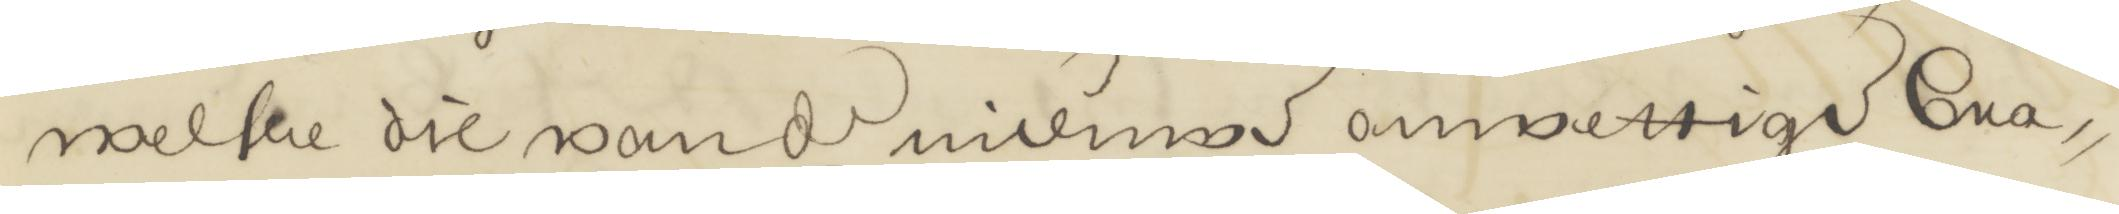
welke die van de nieuwe onwettige bra„
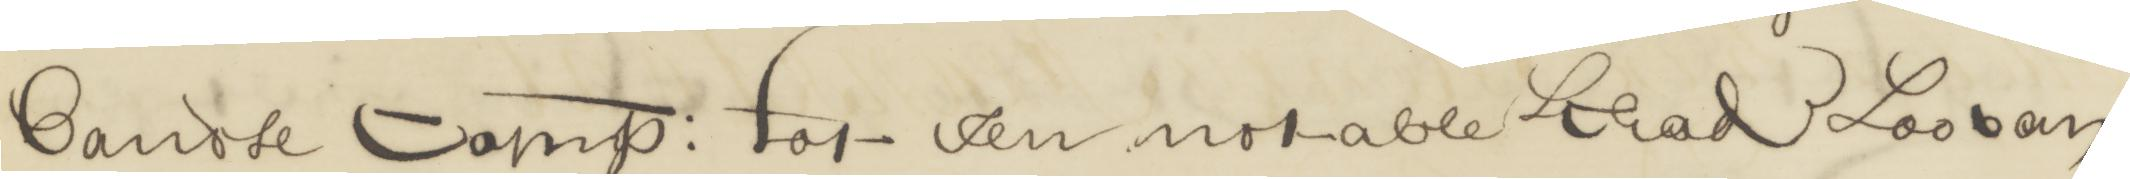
bandse Comp: tot Een notable schade soo van
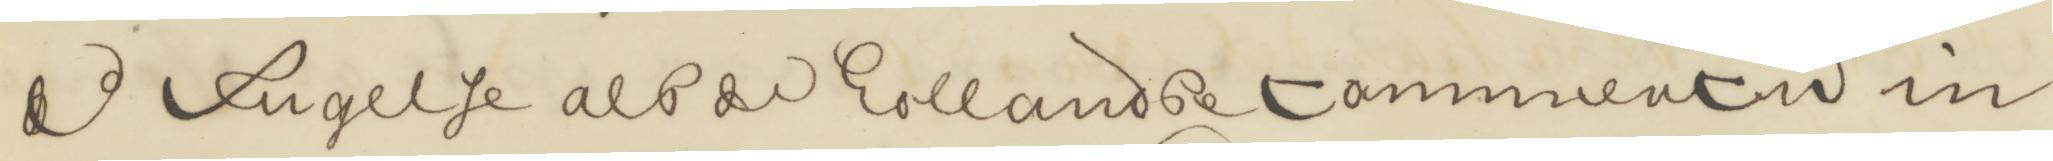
de Engelse als de hollandse commercie in
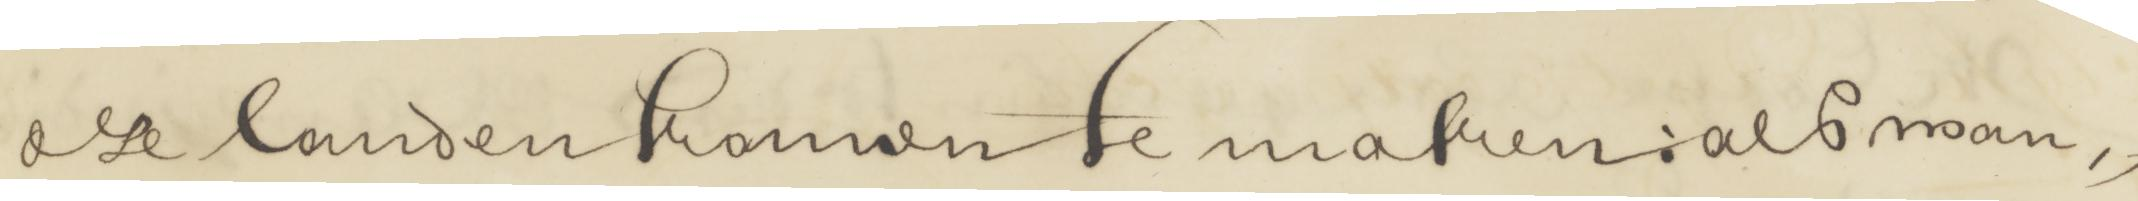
dese landen komen te makens als wan„
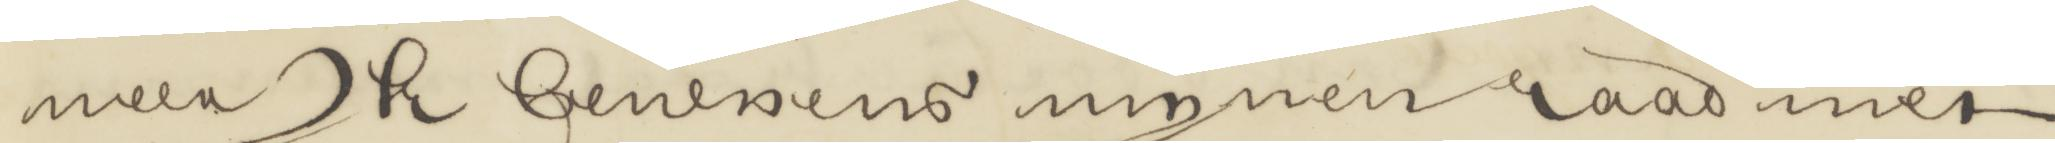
neer Jk benevens mijnen raad niet
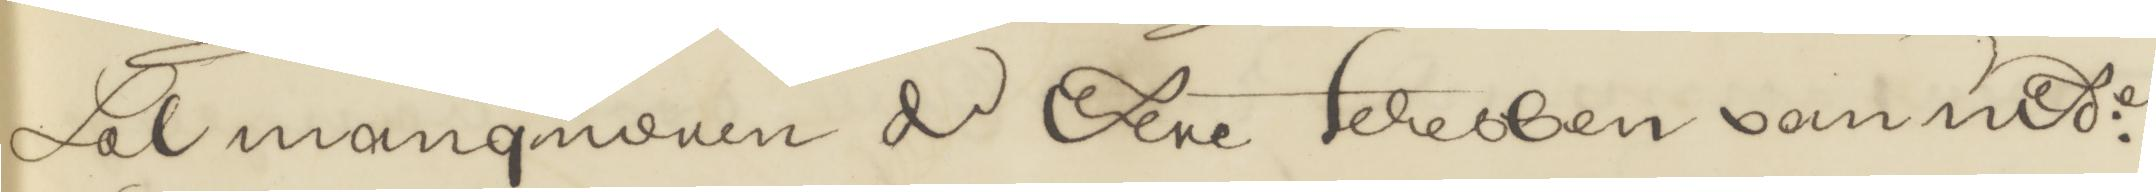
sal manqueren de Eere tehebben van uEd:e
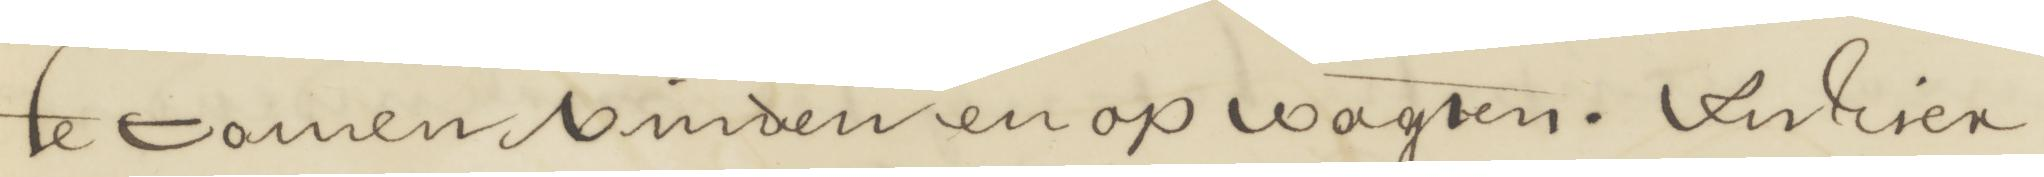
te comen vinden en op wagten. En hier
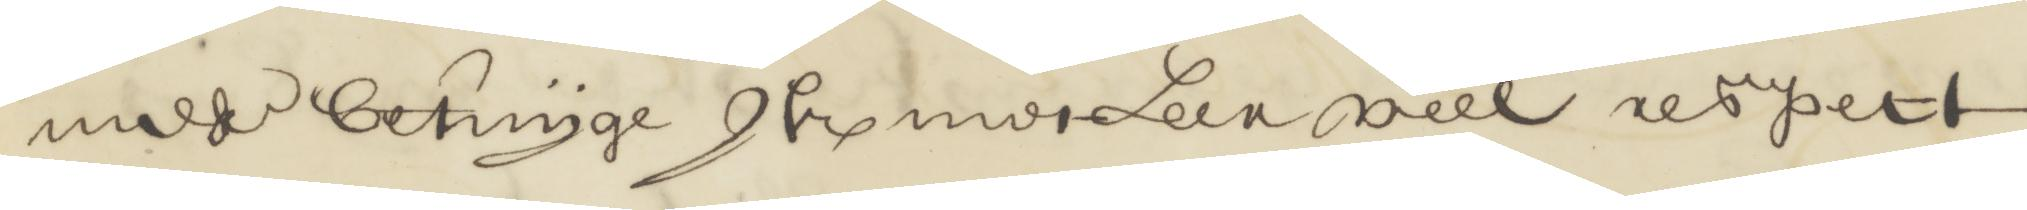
mede betuijge Jk met seer veel respect
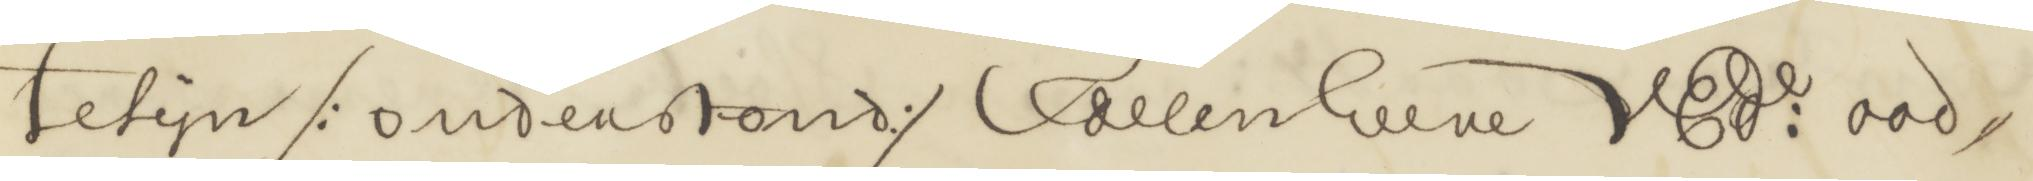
tesijn /:onderstond:/ Edelen heere VEd:e ood„
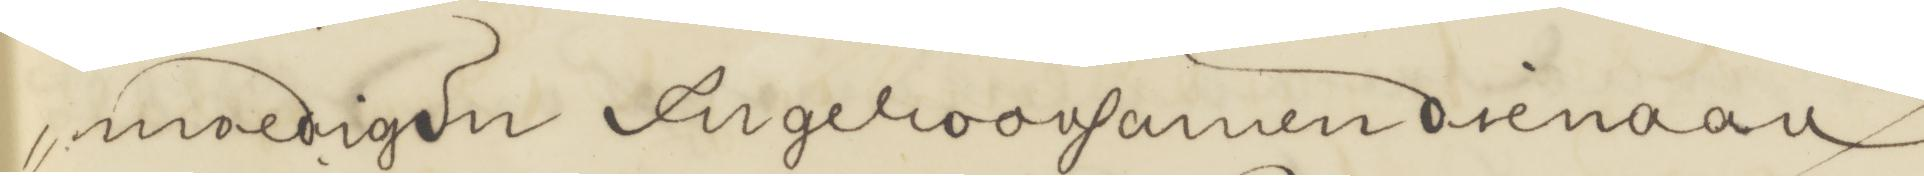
„moedigen En gehoorsamen dienaar
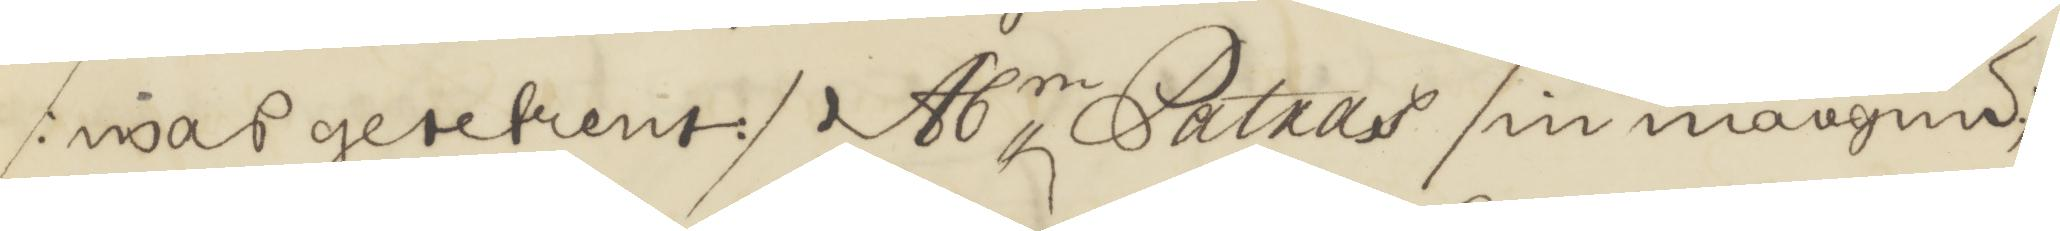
/:was getekent:/ Ab„m Patras /in margine:/
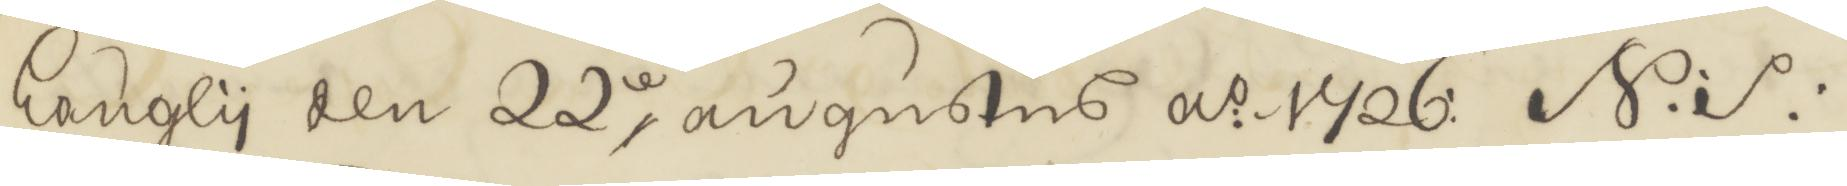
houglij den 22„e augustus a:o 1726: N:S:
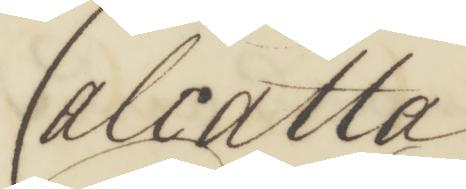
Calcatta
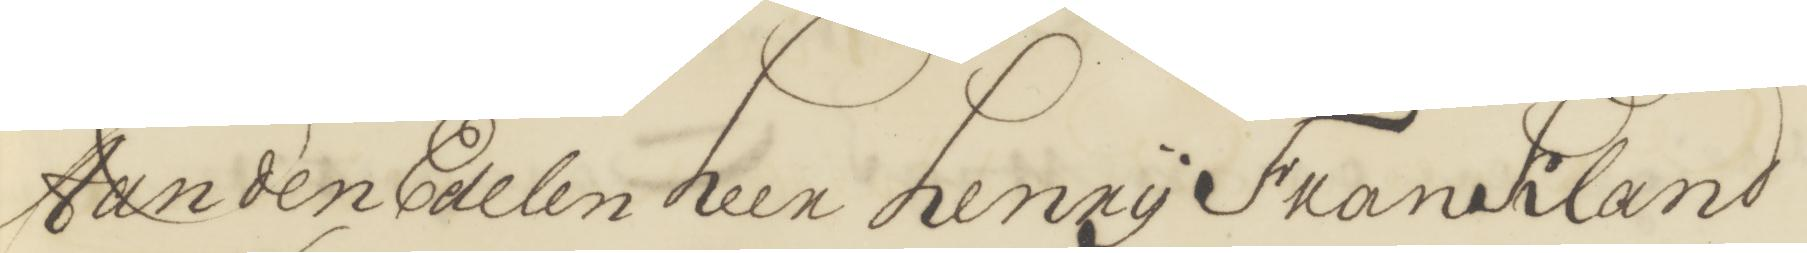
Aan den Edelen heer henrij Frankland
